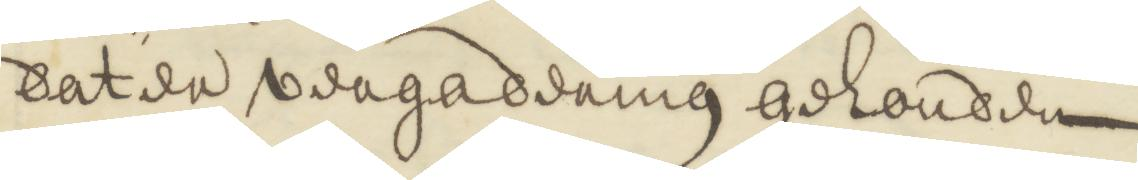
dat er vergadering gehouden
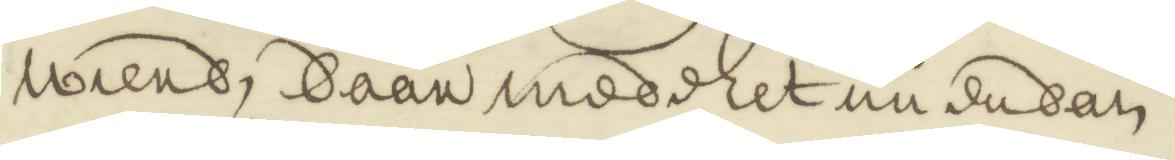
wierd, daar mede het nu en dan
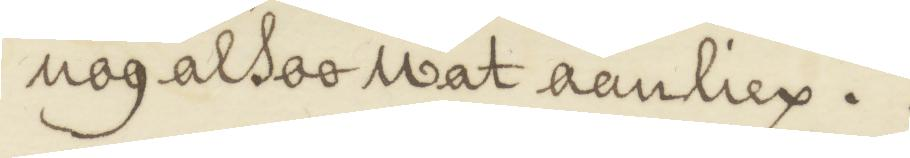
nog alsoo wat aanliep.
